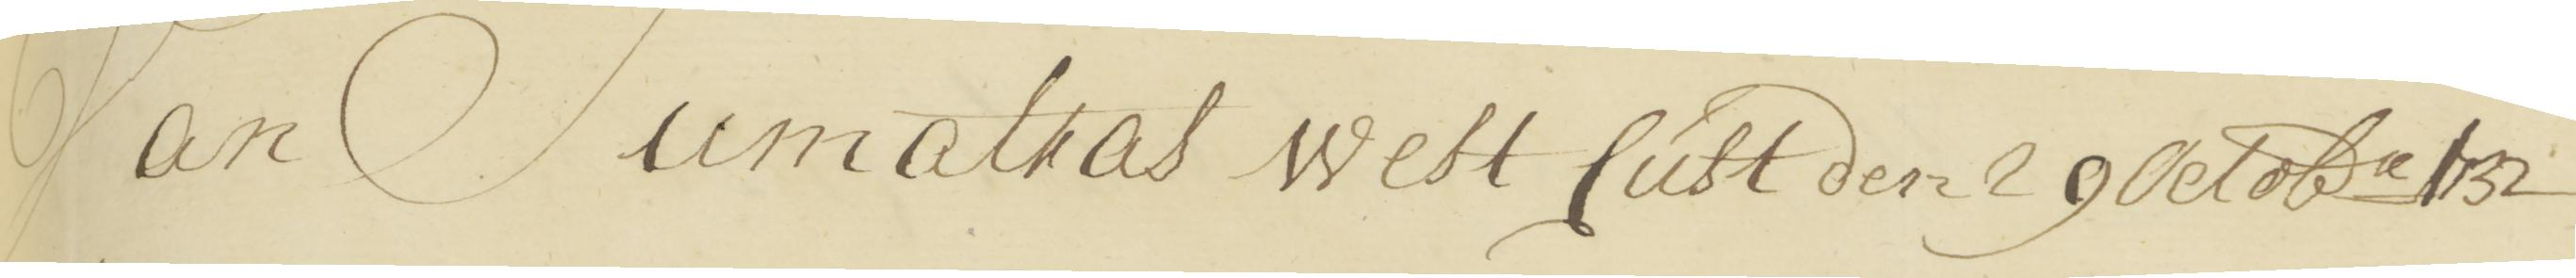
Van Sumatras West Cust den 29 Octob=r 1732
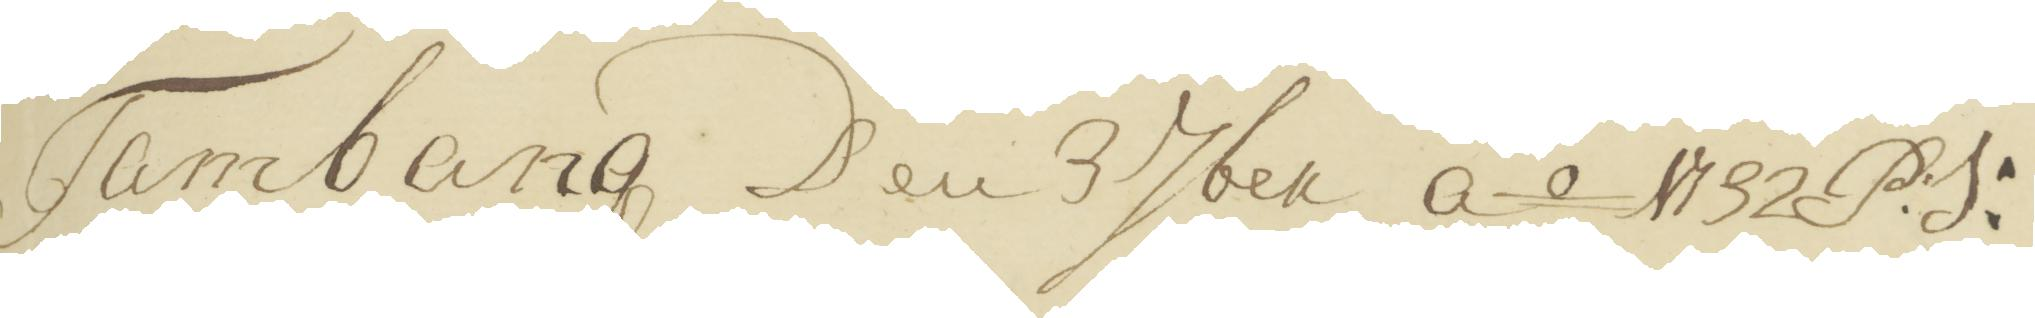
Tambang Den 3 7ber a=o 1732 P: S:
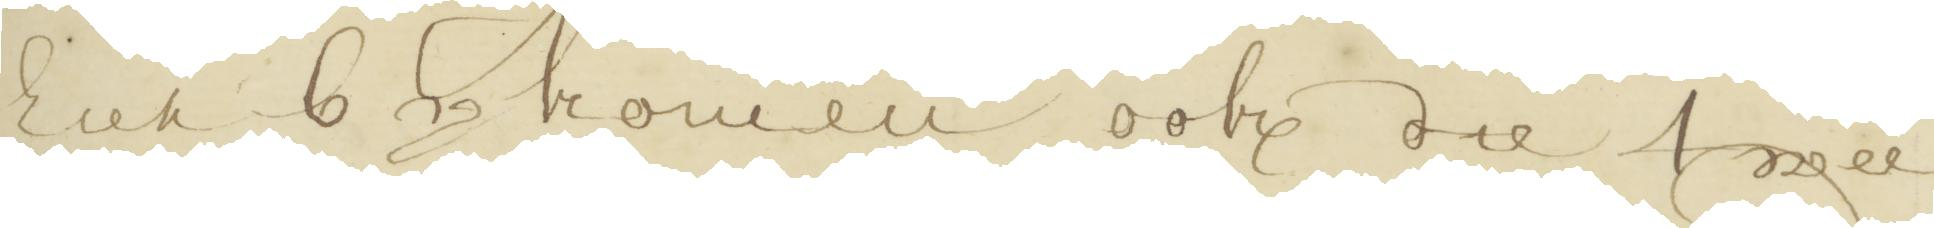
hier by komen ook die twee
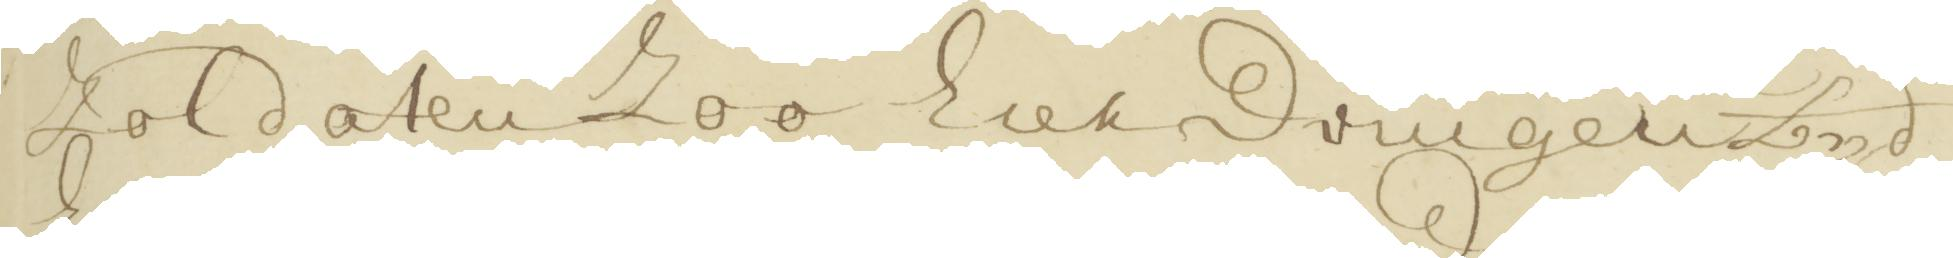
zoldaten zoo hier Eenigen tyd
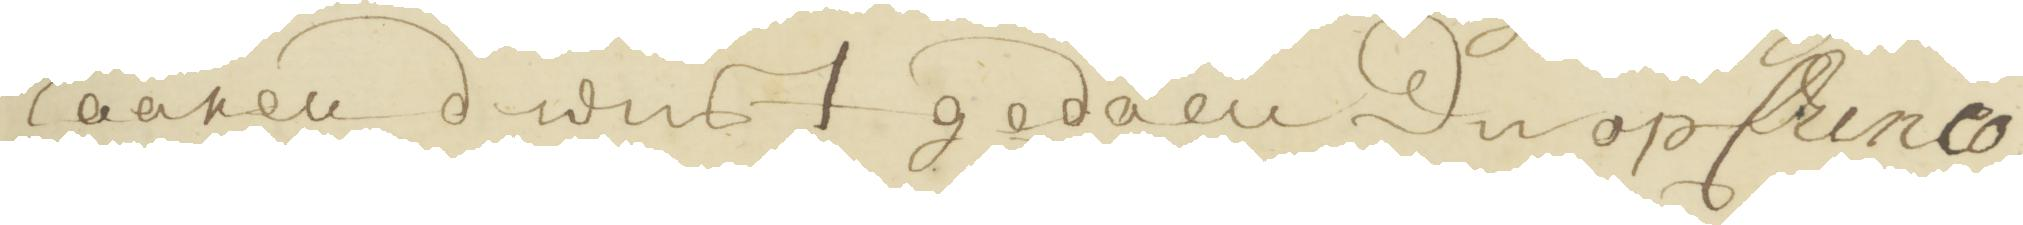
haaren dienst gedaen En op Chinco
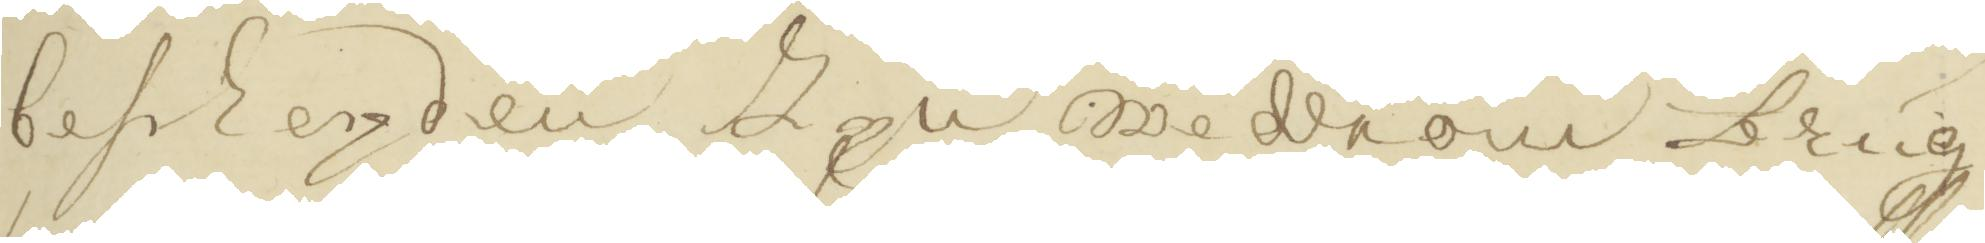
bescheyden zyn wederom terug
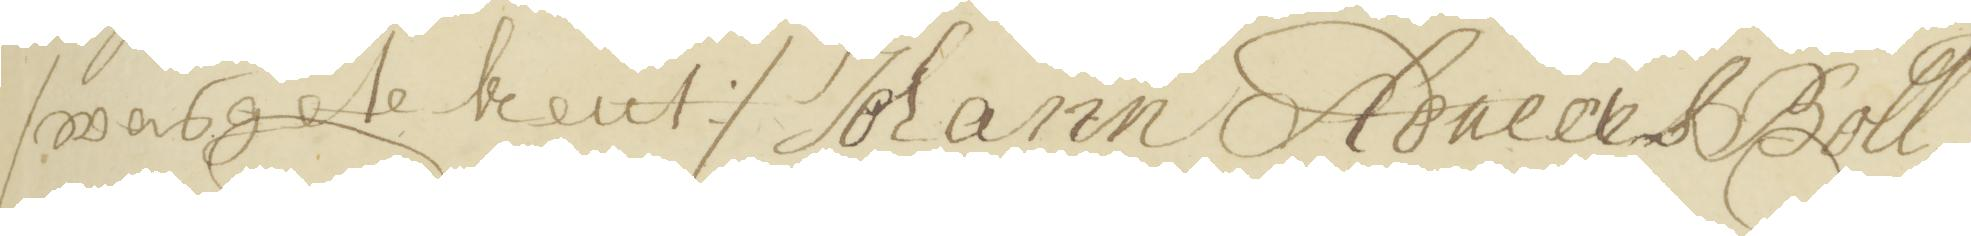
/:was getekent:/ Johann Andreas Boll
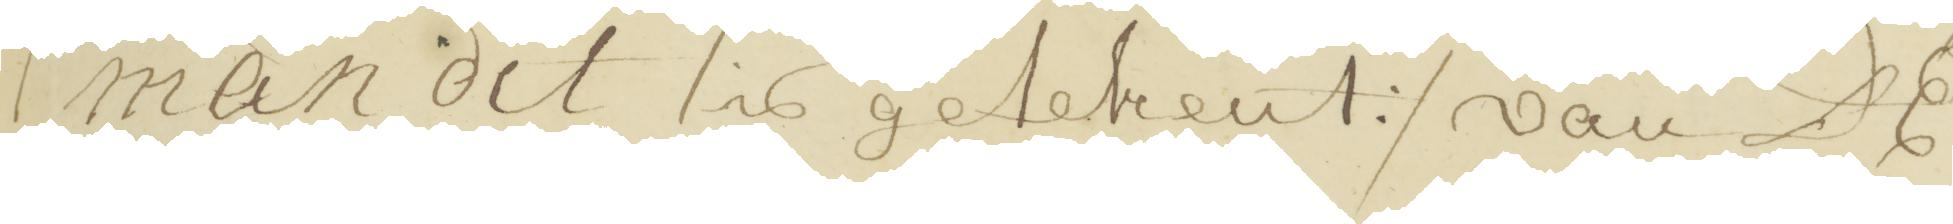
man dit is getekent:/ van D E
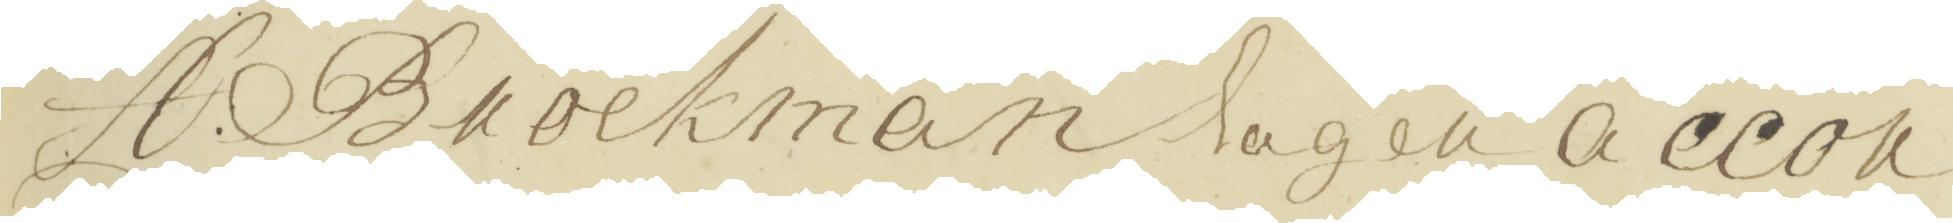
A. Broekman lager accor
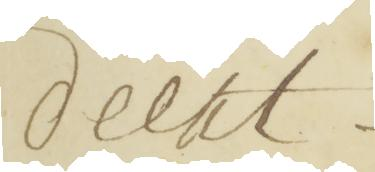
deert
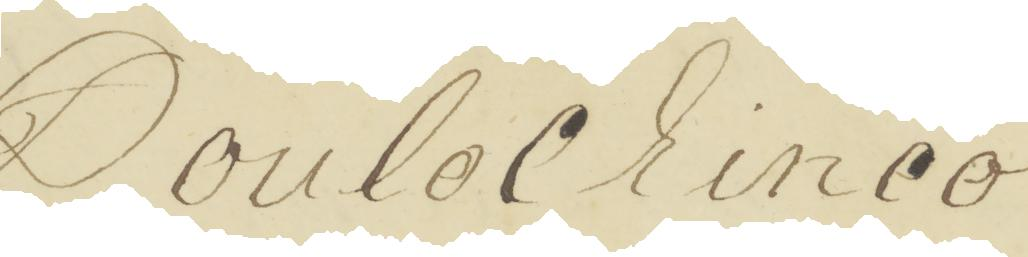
Poulochinco
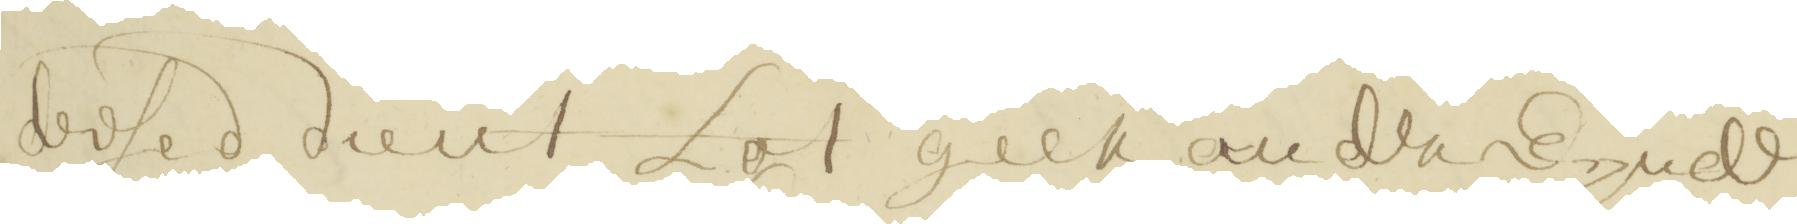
desse d dient tot geen ander Eynde
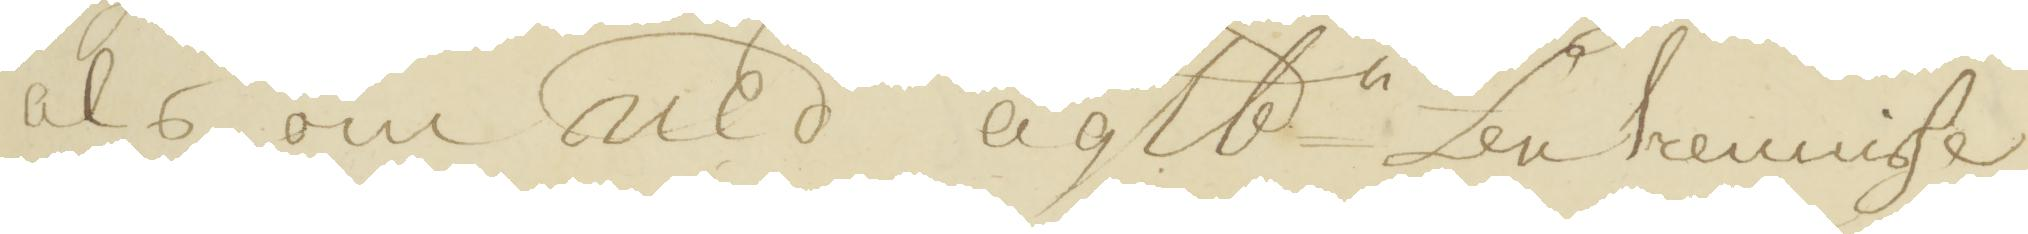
als om uEd agtb=n ter kennisse
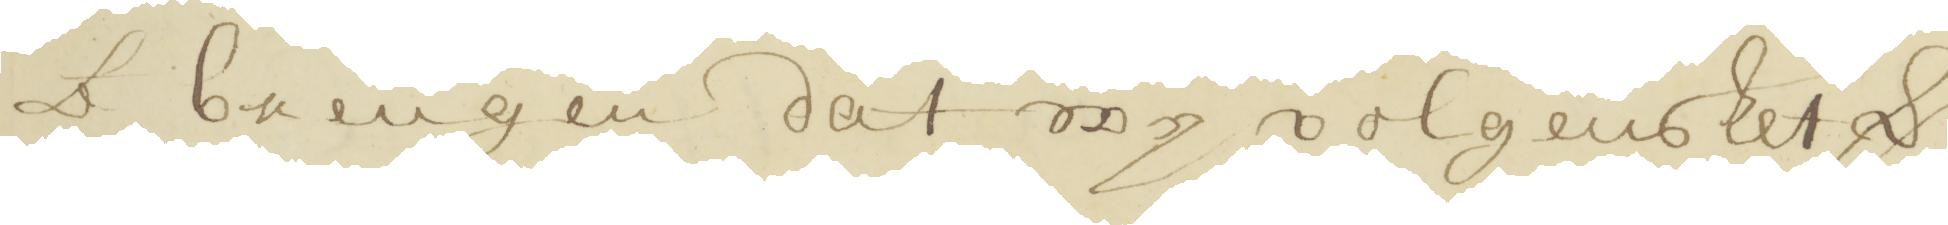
te brengen dat wy volgens het ver
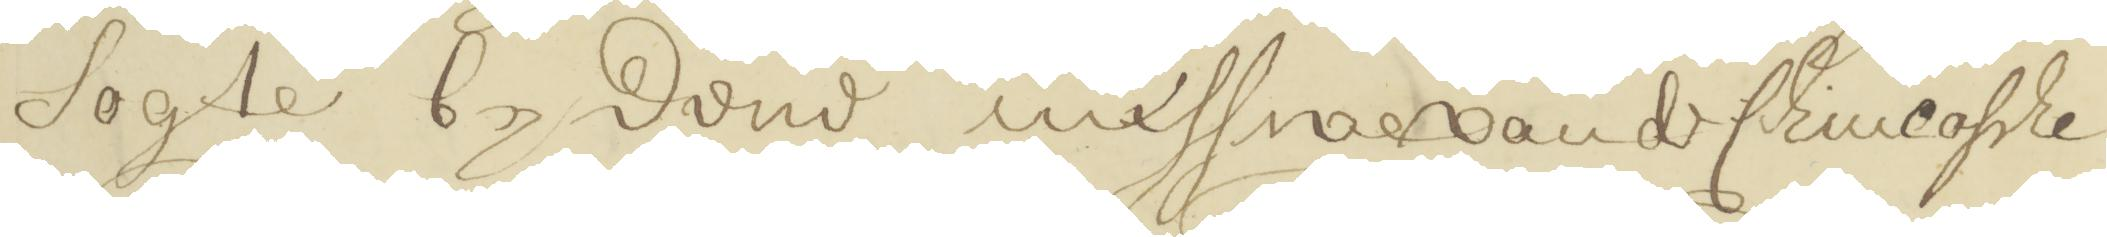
sogte by eene missive van de Chincosche
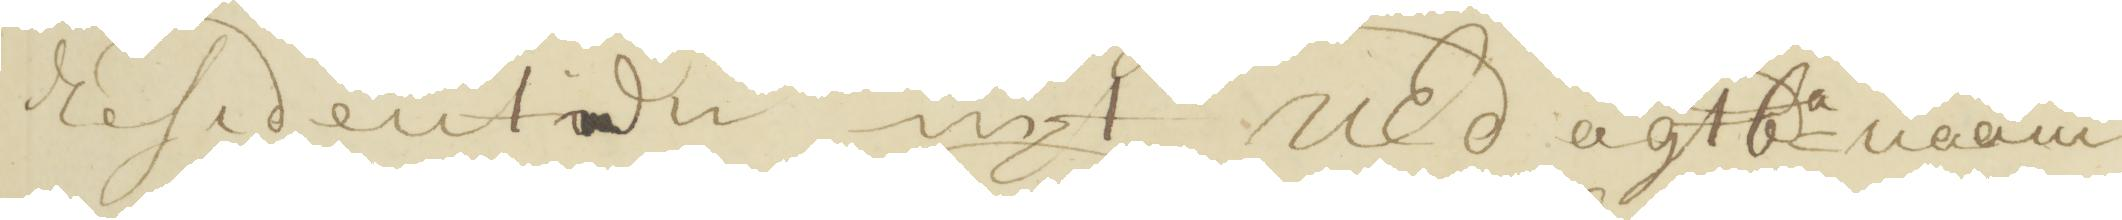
residenten uyt uEd: agtb=a naam
